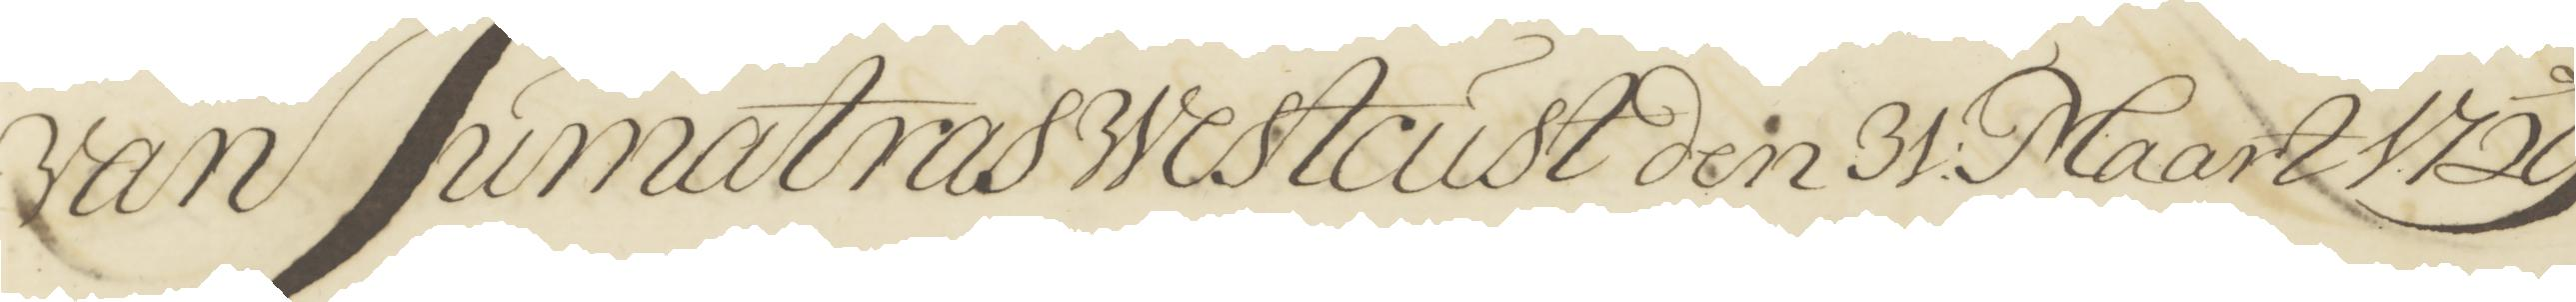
Van Sumatras westcust den 31:' Maart 1729
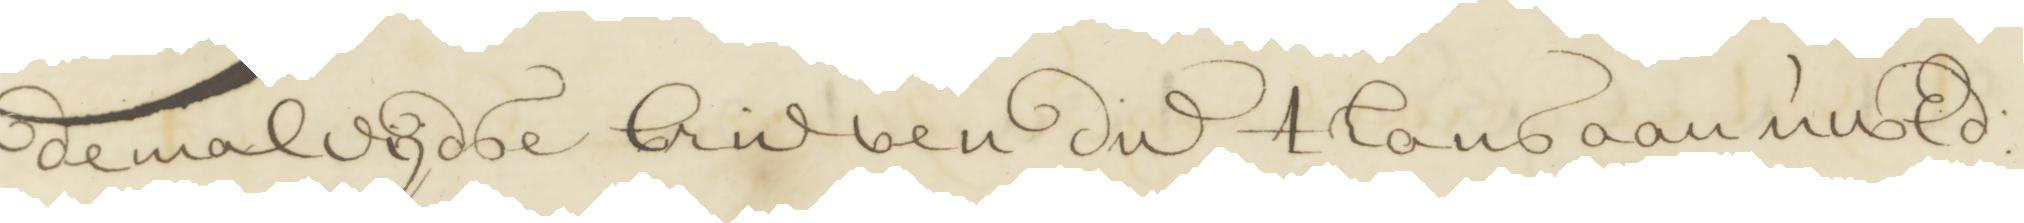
de maleijdse brieven die thans aan uwEd:
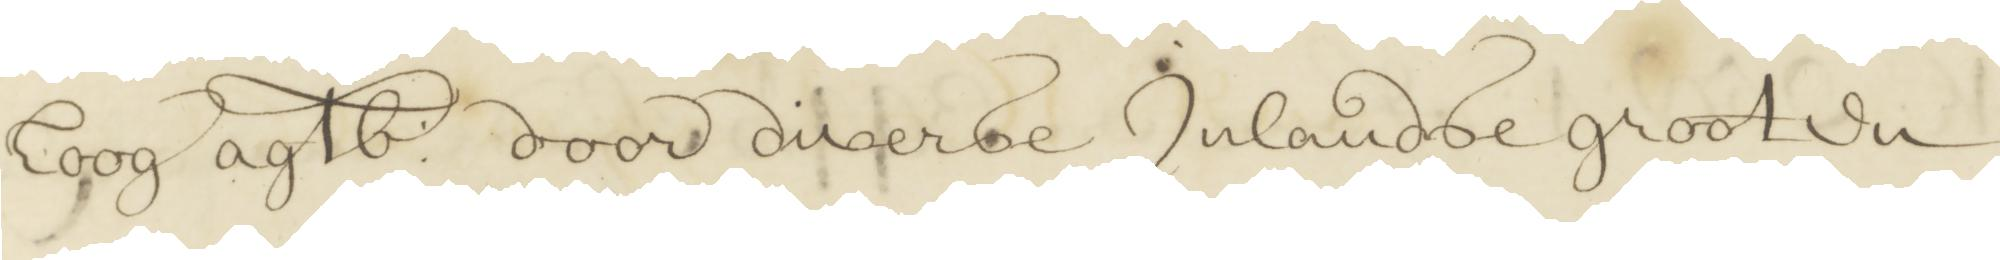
hoog agtb: door diverse Jnlandse grooten
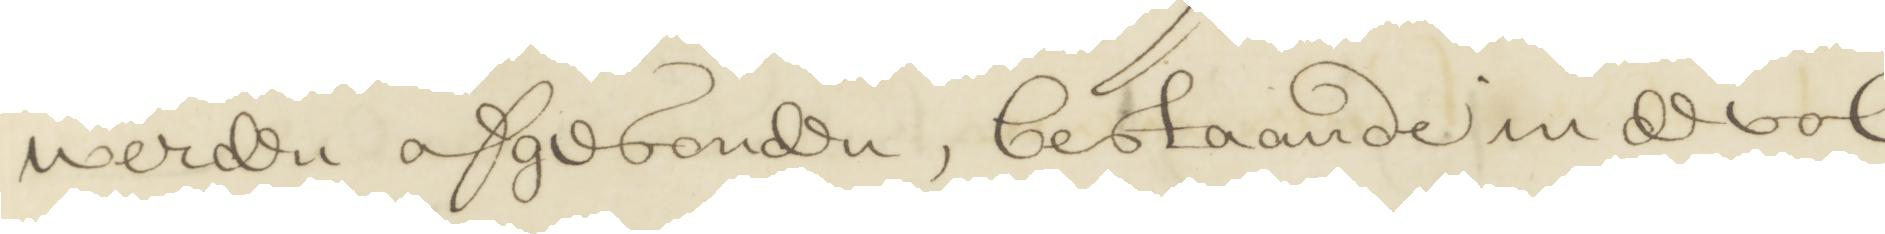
werden afgesonden, bestaande in de vol
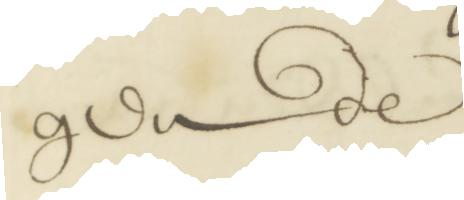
gende
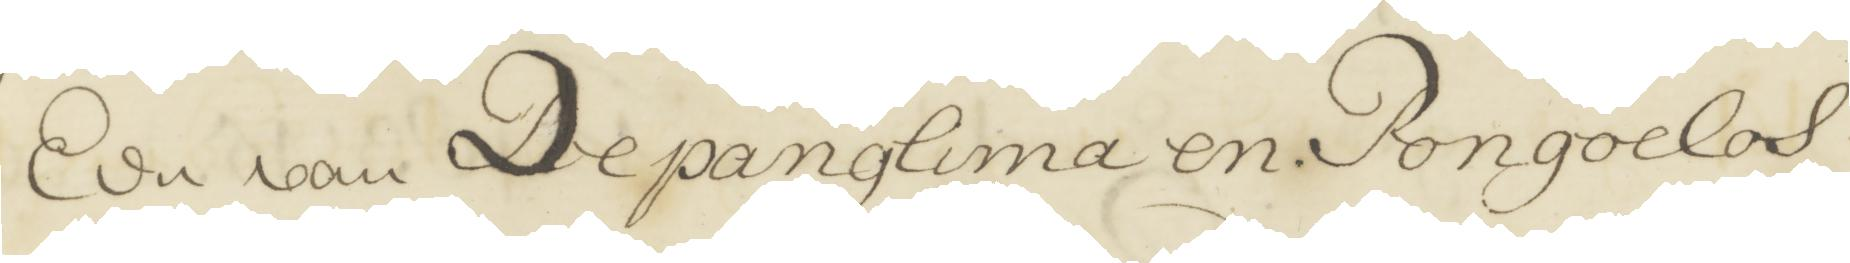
Een van De panglima en Pongoelos
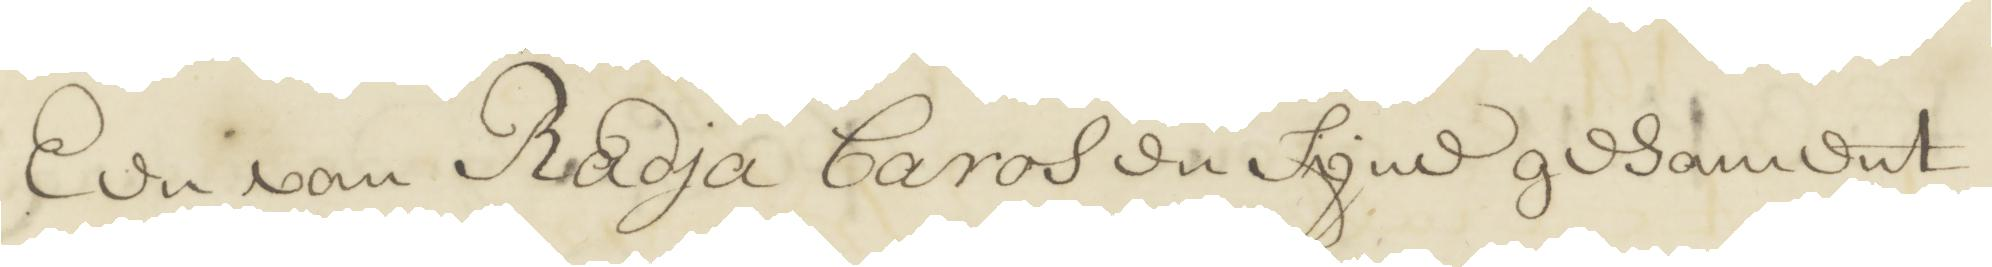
Een van Radja baros en sijne gesament
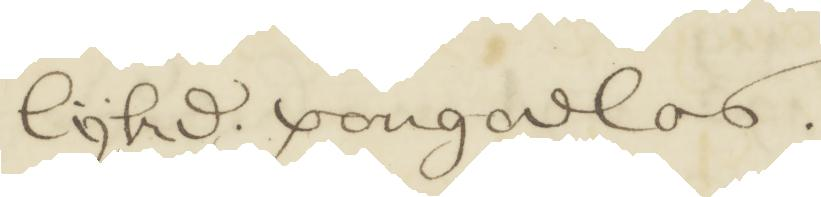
lijke. pongoelos.
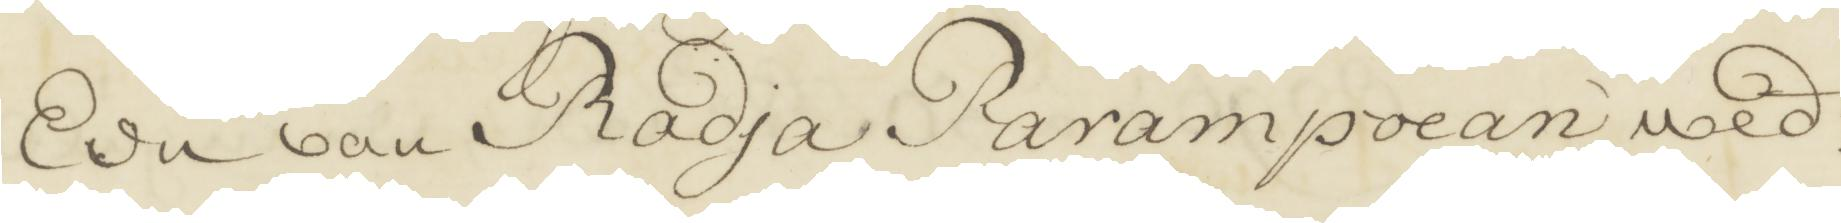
Een van Radja Parampoean wed
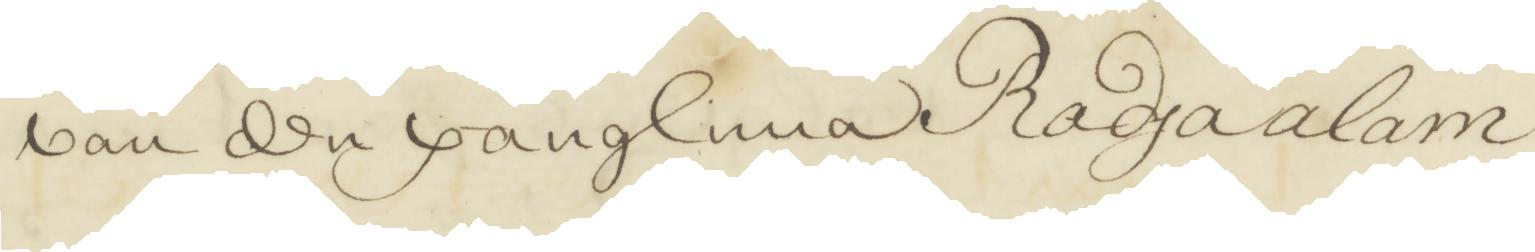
van den panglima Radjaalam
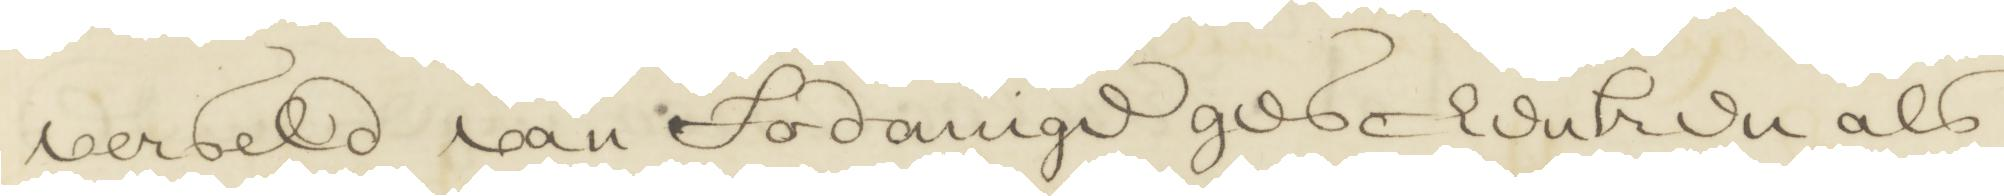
verseld van sodanige geschenken als
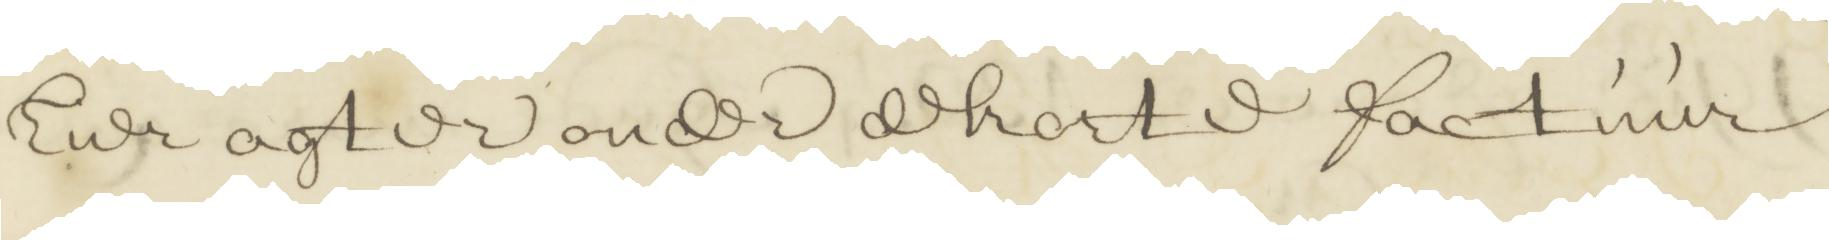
hier agter onder de korte factuur
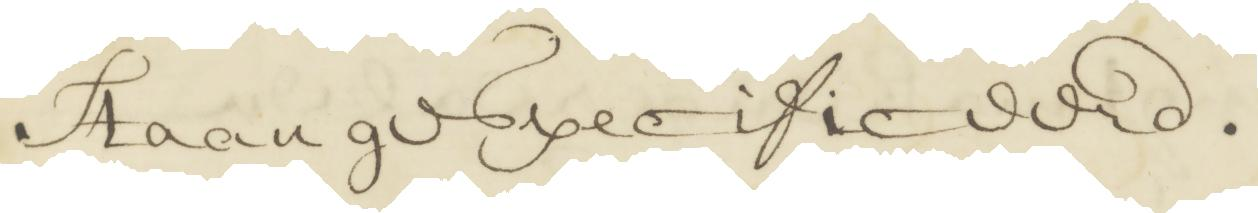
staan gespecificeerd.
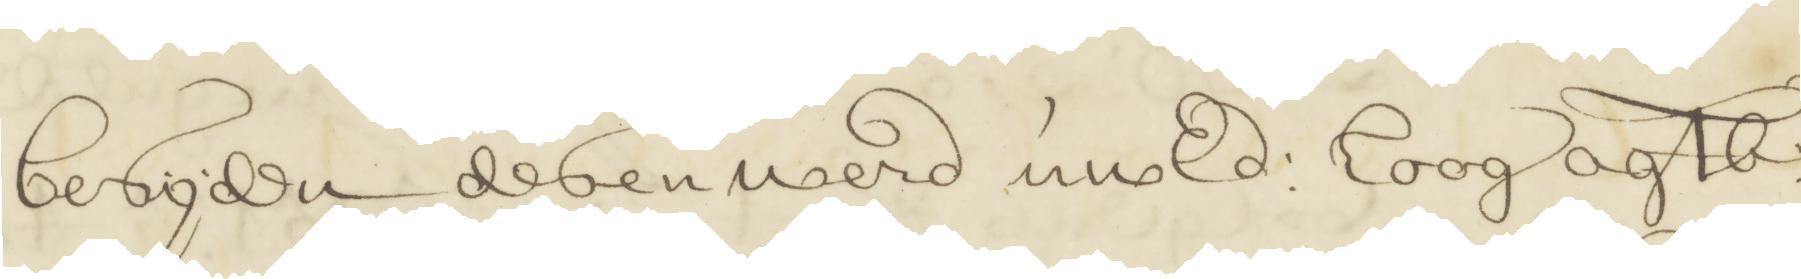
besijden desen werd uwEd: hoog agtb
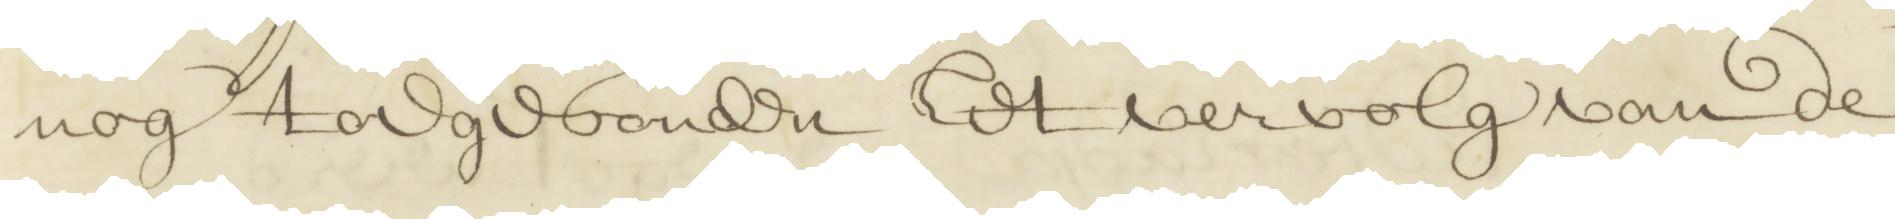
nog toegesonden het vervolg van de
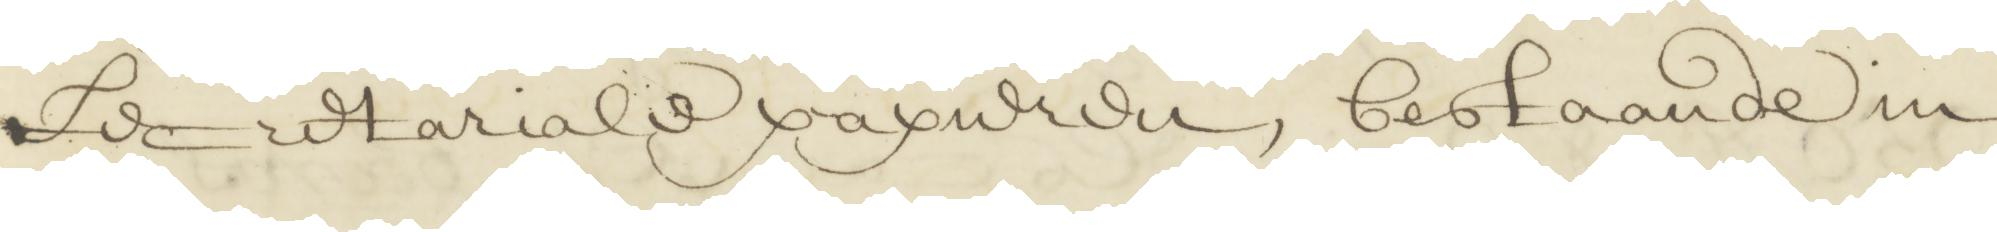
secretariale papieren, bestaande in
